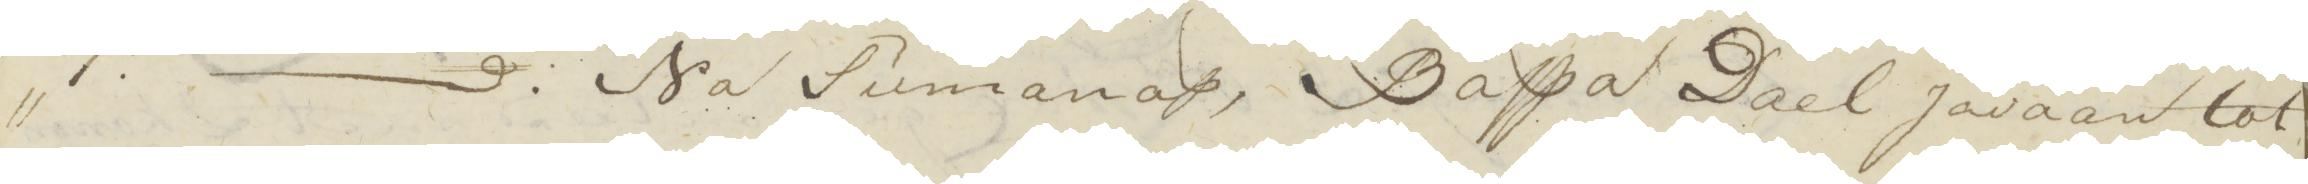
„ 7: _:o Na Sumanap, Bappa Dael Javaan tot
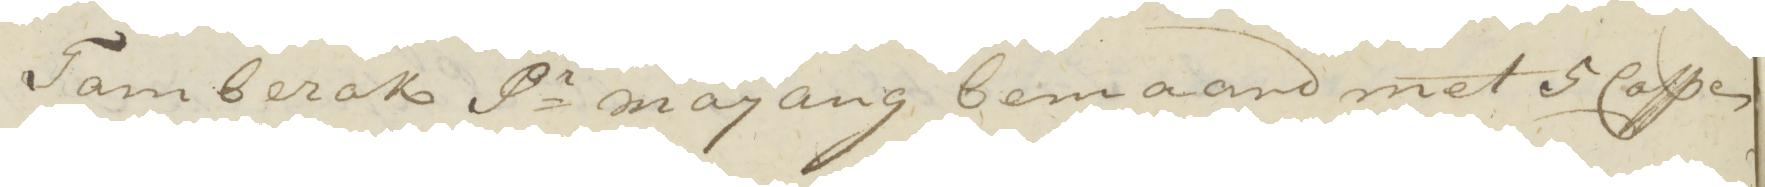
Tamberak P=r maijang bemaand met 5 Coppen
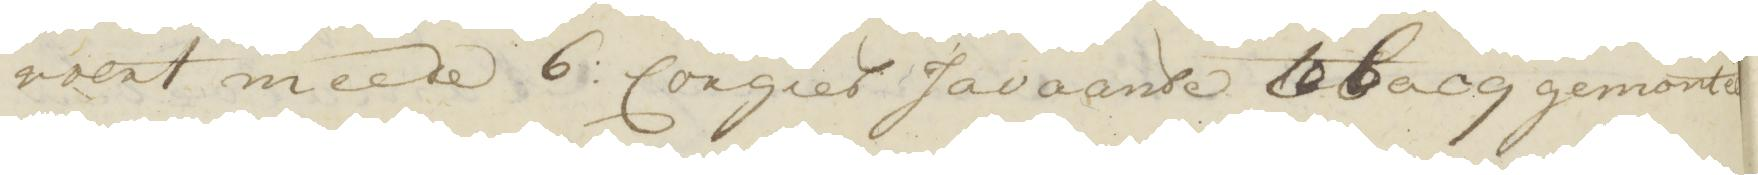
voert meede 6: Corgies Javaanse tobacq gemonte
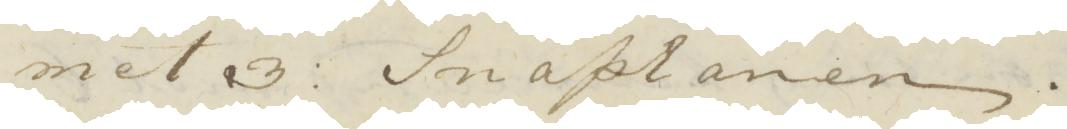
met 3: snaphanen.
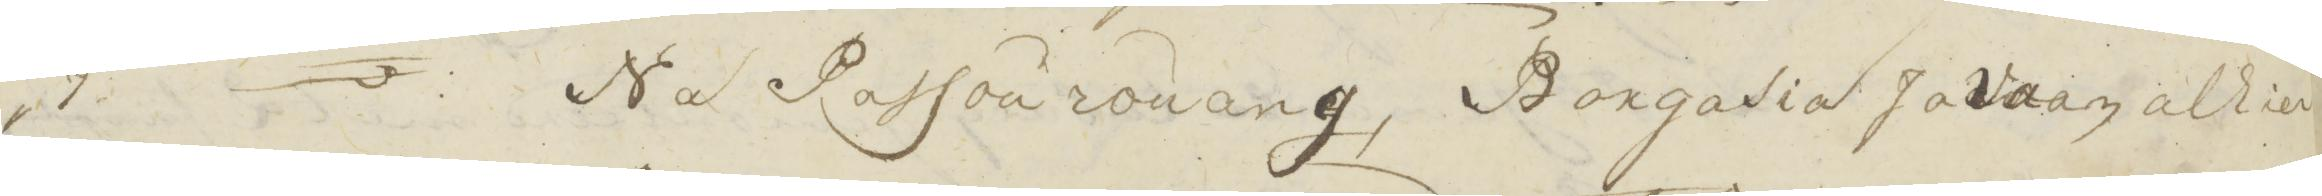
„ 7: _:o Na Passourouang, Borgasia Javaan alhier
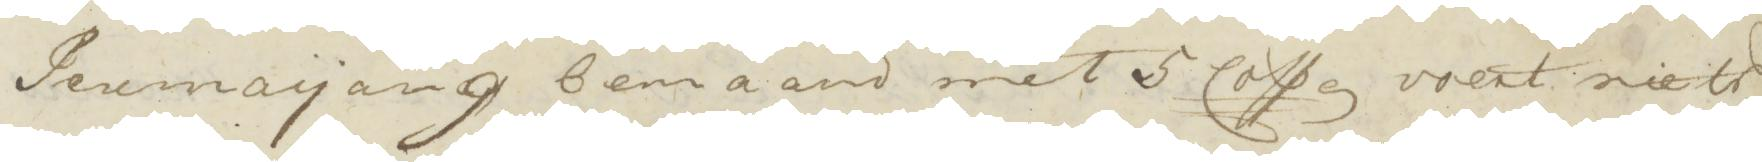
Permaijang bemaand met 5 Coppen voert niets
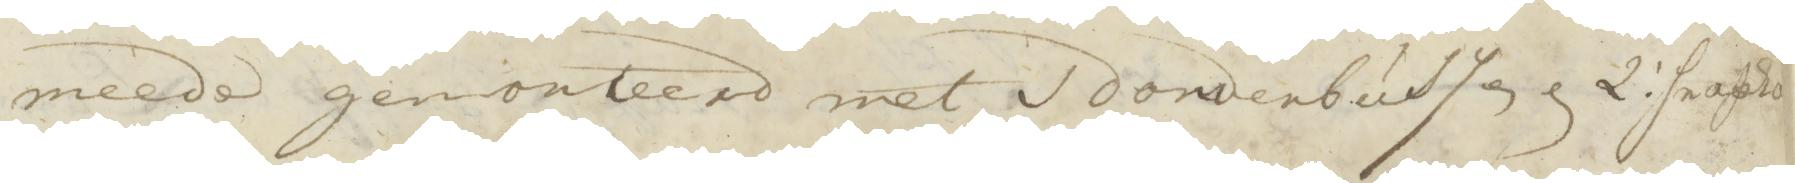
meede gemonteerd met 1 donderbussen en 2: snapha
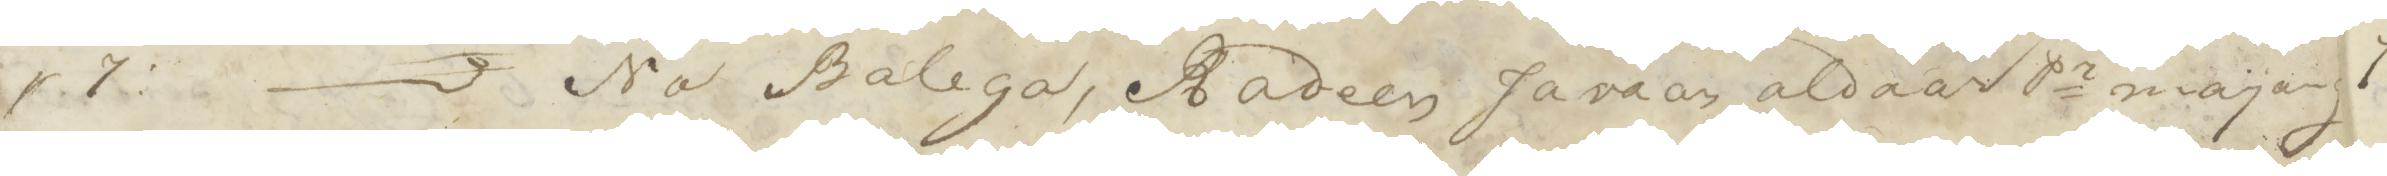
7: _:o Na Balega, Radeen Javaan aldaar P=r maijang
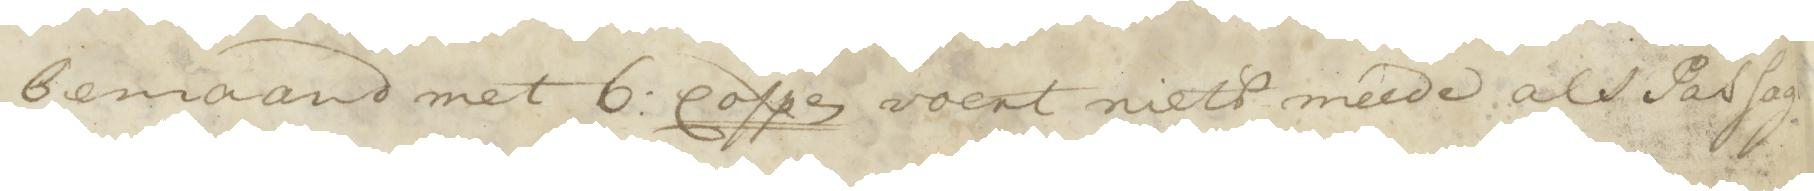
bemaand met 6: Coppen voert niets meede als Passag
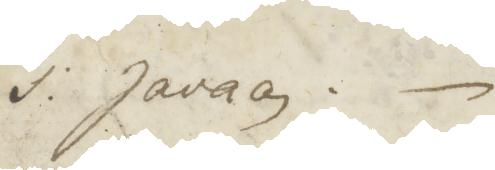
1: Javaan. —
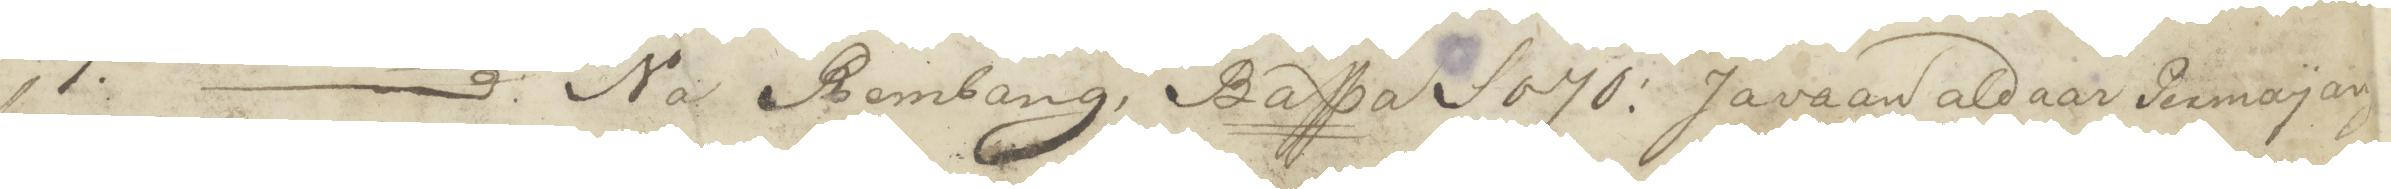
7: _:o Na Rembang, Bappa Sojo: Javaan aldaar Permaijang
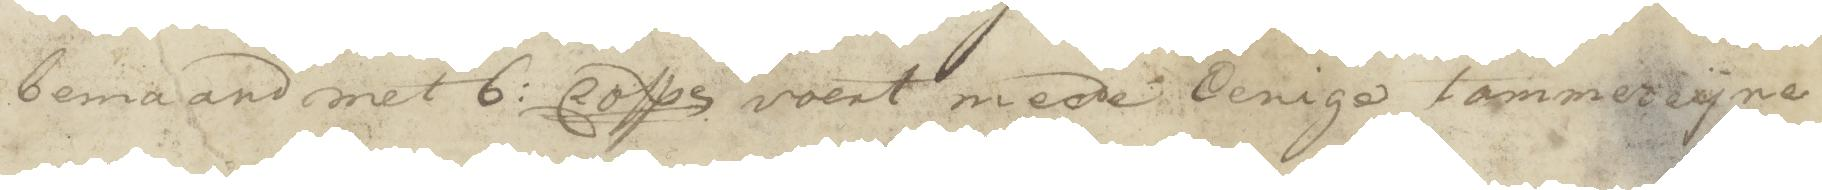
bemaand met 6: Coppen voert meede Eenige tommereijne
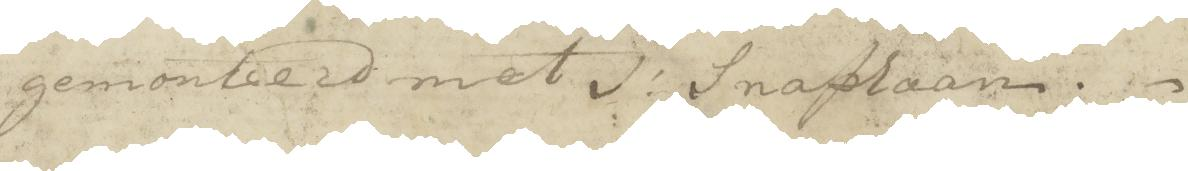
gemonteerd met 1: snaphaan. —
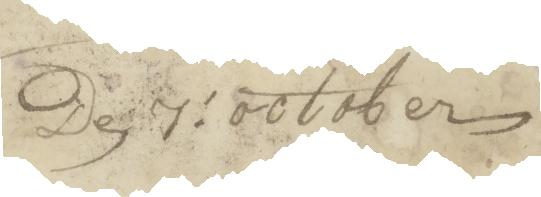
Den 7: october
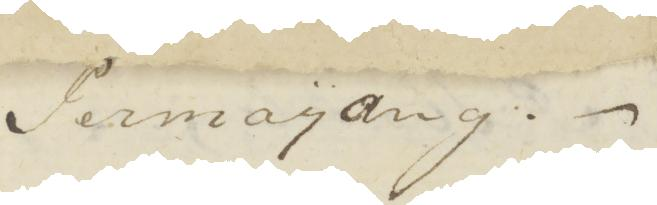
Permaijang. —
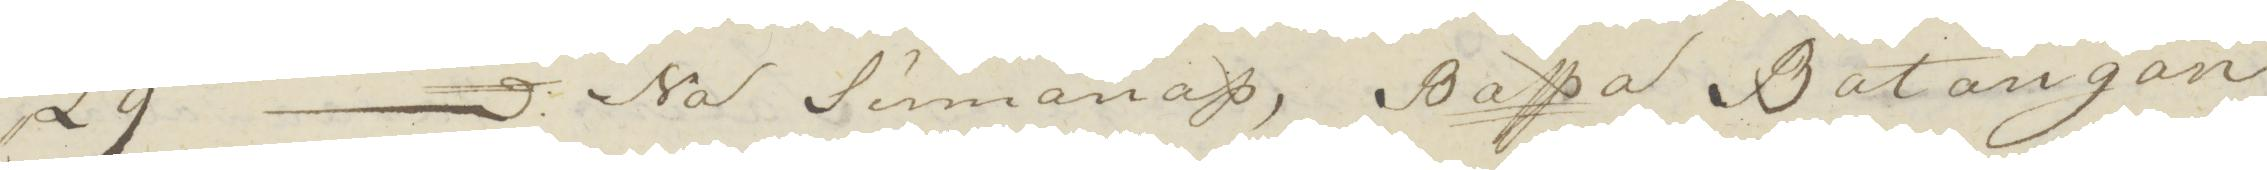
„ 29 _:o Na sumanap, Bappa Batangan
